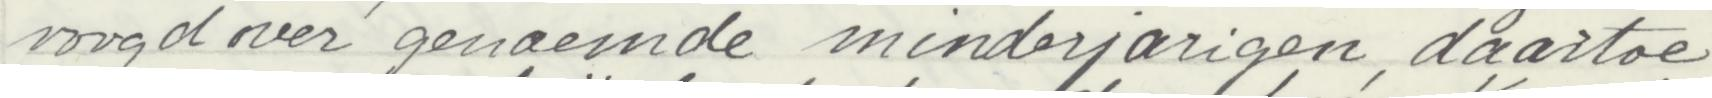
voogd over genoemde minderjarigen, daartoe
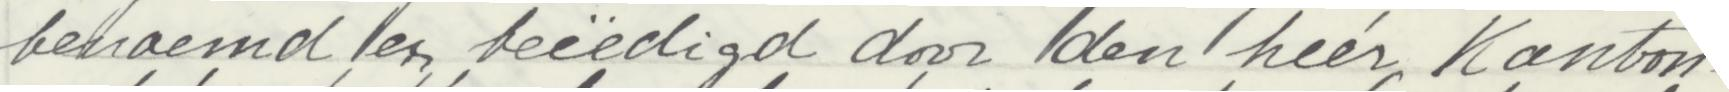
benoemd en beëedigd door den heer Kanton-
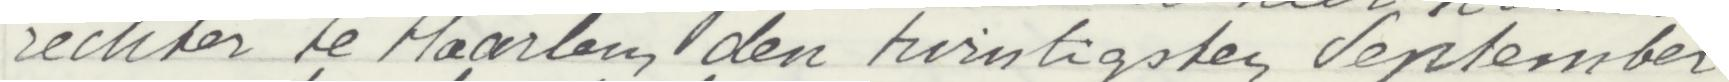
rechter te Harlem den twintigsten September
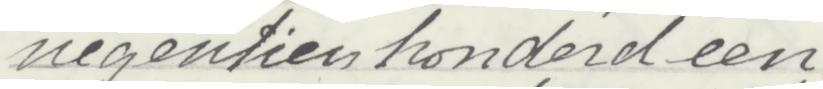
negentien honderd een
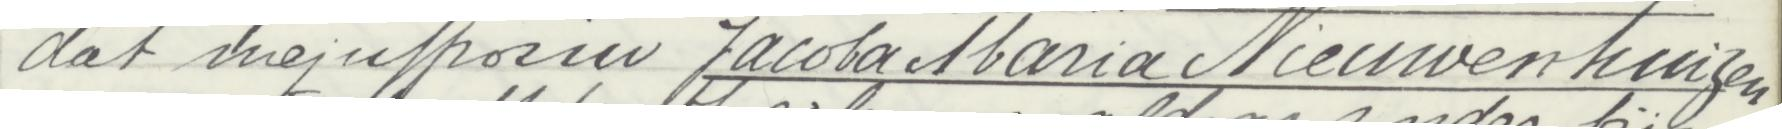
dat mejuffrouw Jacoba Maria Nieuwenhuizen
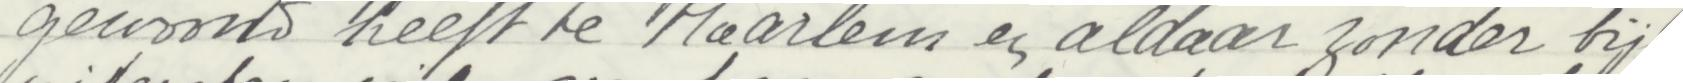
gewoond heeft te Haarlem en aldaar zonder bij
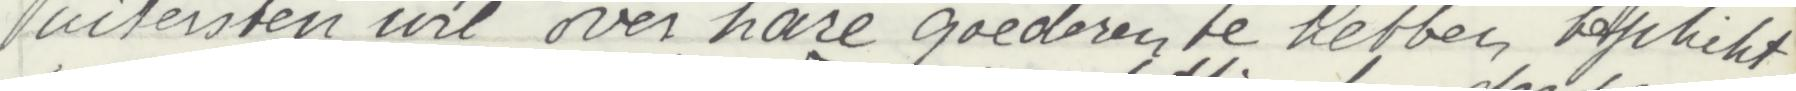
uitersten wil over hare goederen te hebben beschikt
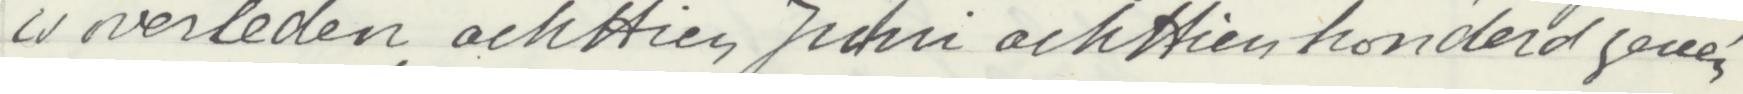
is overleden achttien Juni achttien honderd zeven
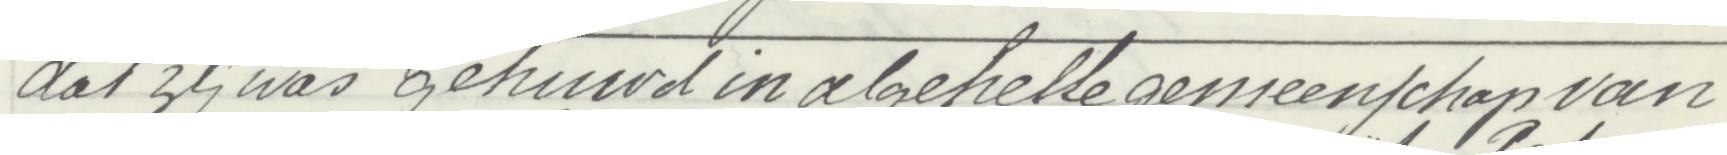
dat zij was gehuwd in algeheele gemeenschap van
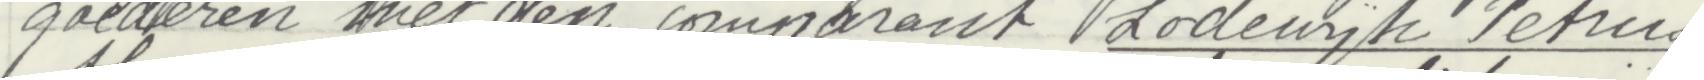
goederen met den comparant Lodewijk Petrus
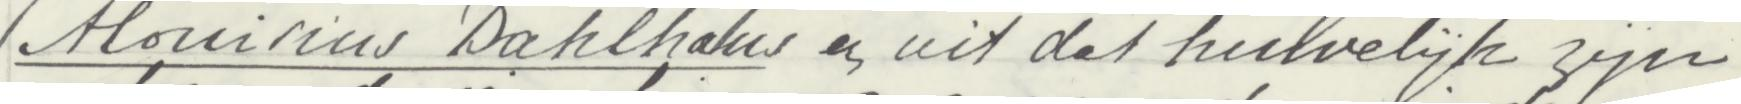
Alouisius Dahlhaus en uit dat huwelijk zijn
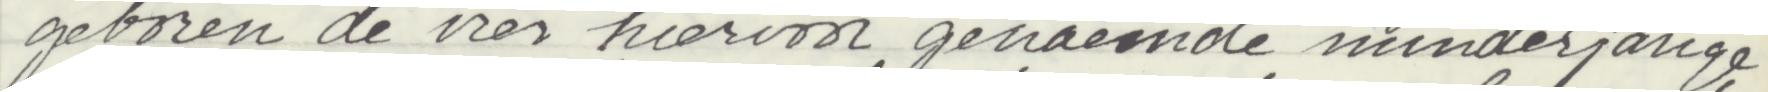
geboren de vier hiervoor genoemde minderjarige
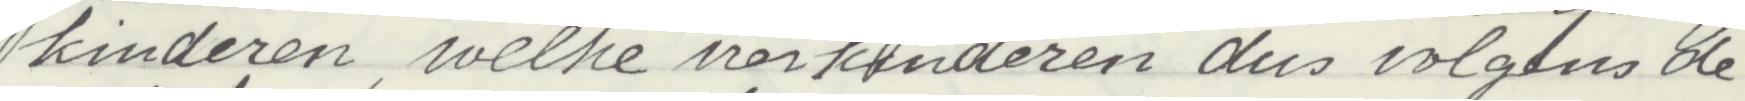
kinderen, welke vier kinderen dus volgens de
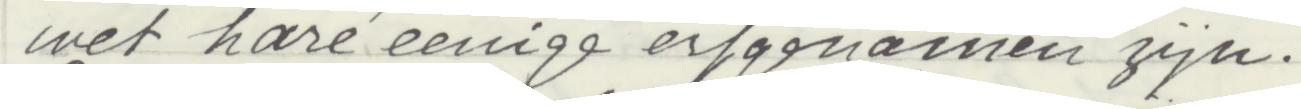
wet hare eenige erfgenamen zijn.
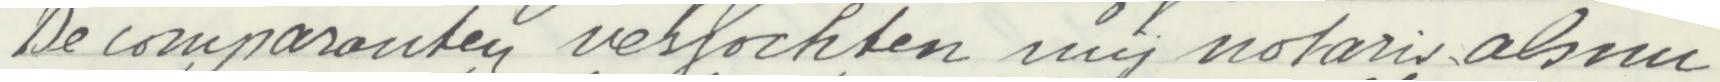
De comparanten verzochten mij notaris als nu
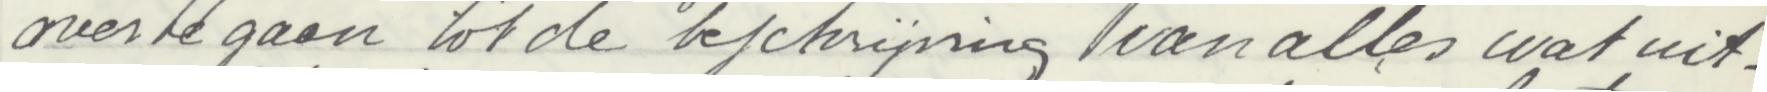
over te gaan tot de beschrijving van alles wat uit-
